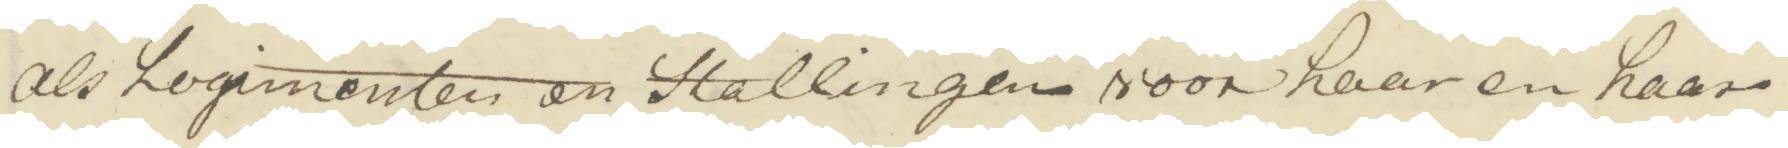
als Logimenten en stallingen voor haar en haar
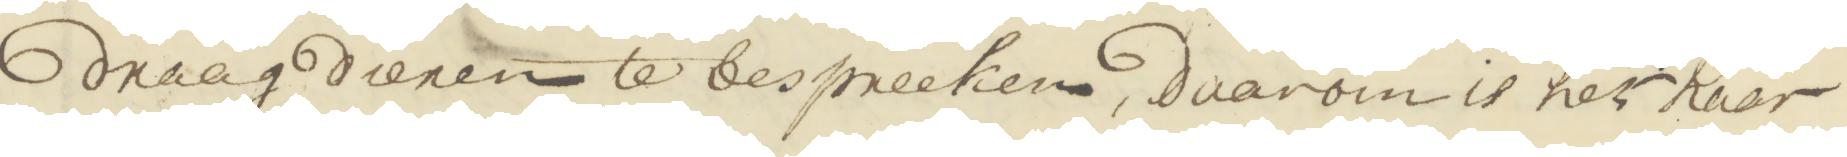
draagdieren te bespreeken, daarom is het haar
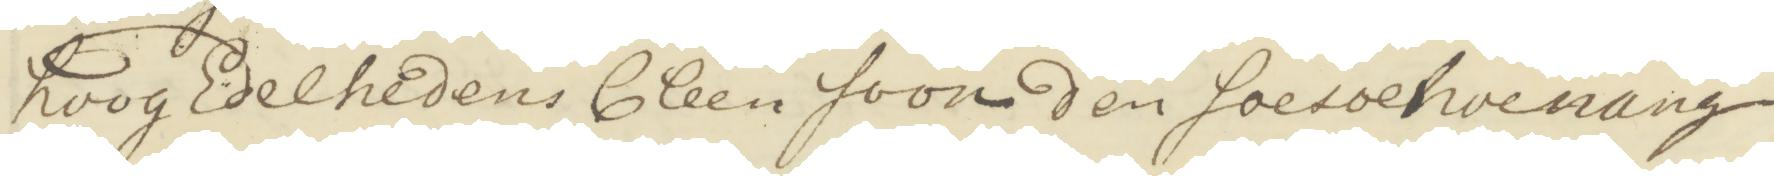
hoog Edelhedens Cleensoon den Soesoehoenang
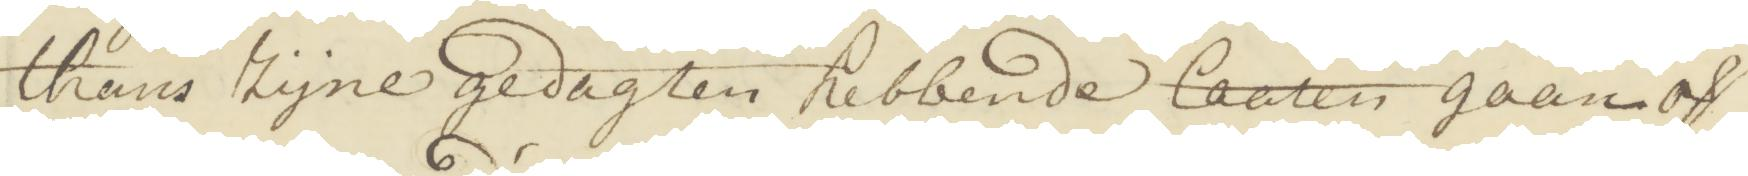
thans zijne gedagten hebbende laaten gaan over
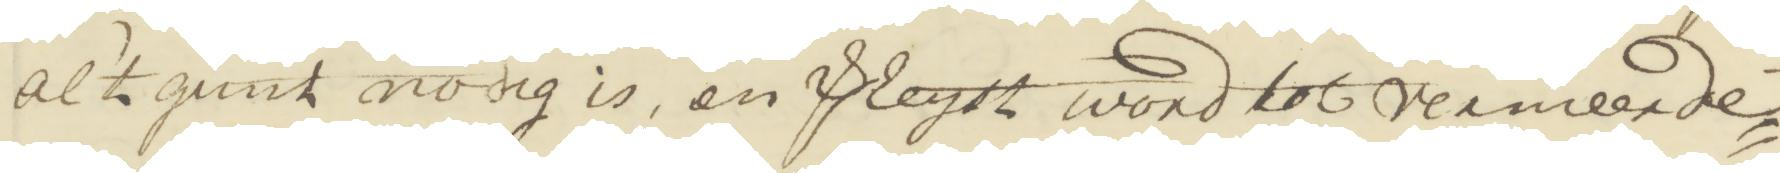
al 't gunt nodig is, en verEijst word tot vermeerde=
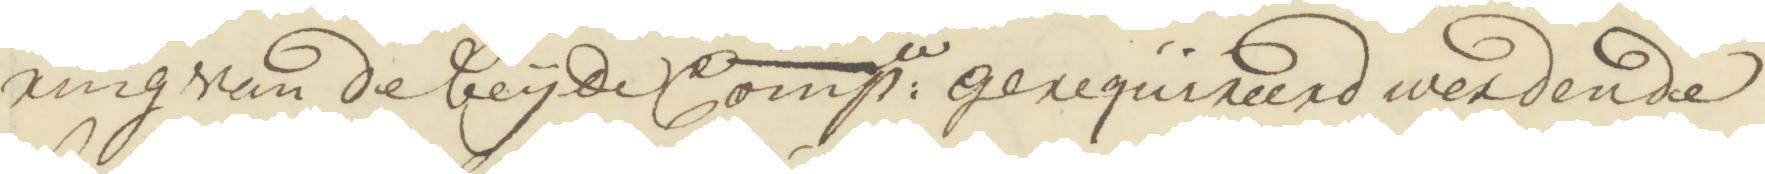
ring van de beijde Comp:ie gerequireerd werdende
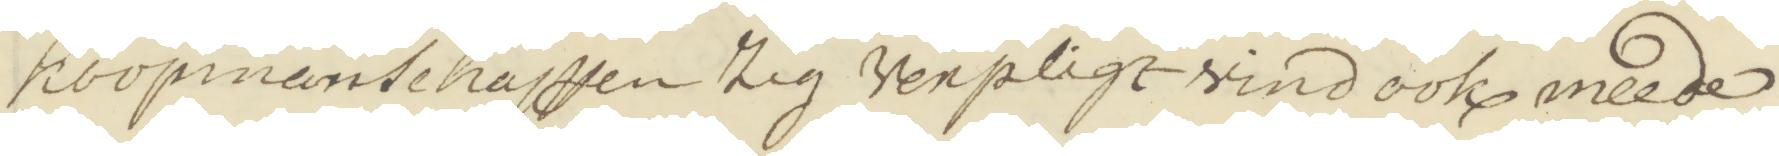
koopmanschappen Zig verpligt vind ook meede
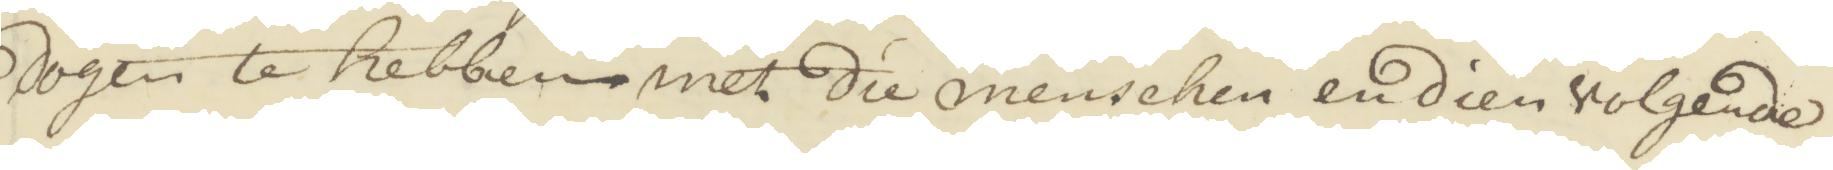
dogen te hebben met die menschen en dien volgende
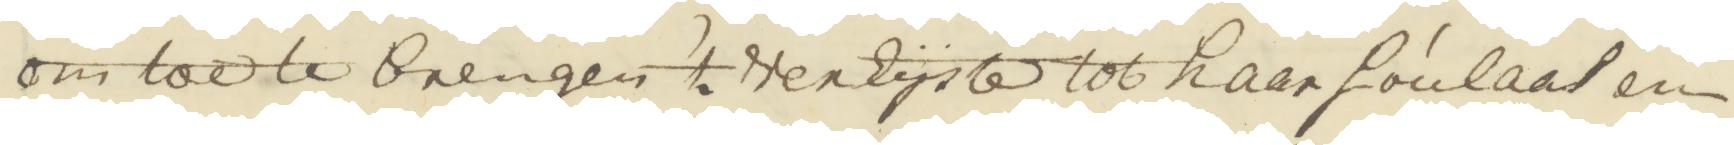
om toe te brengen ’t verEijste tot haar soulaas en
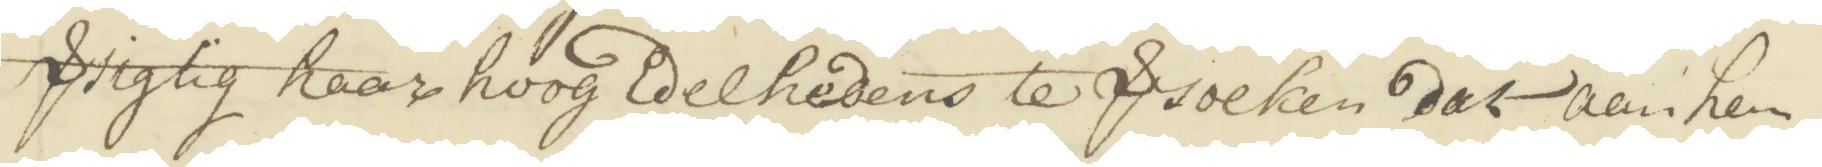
versigtig haar hoog Edelhedens te versoeken dat aan hen
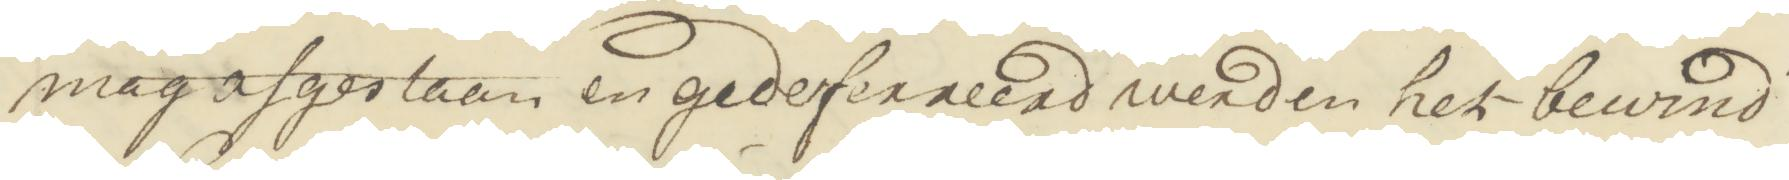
mag afgestaan en gedeferreerd werden het bewind
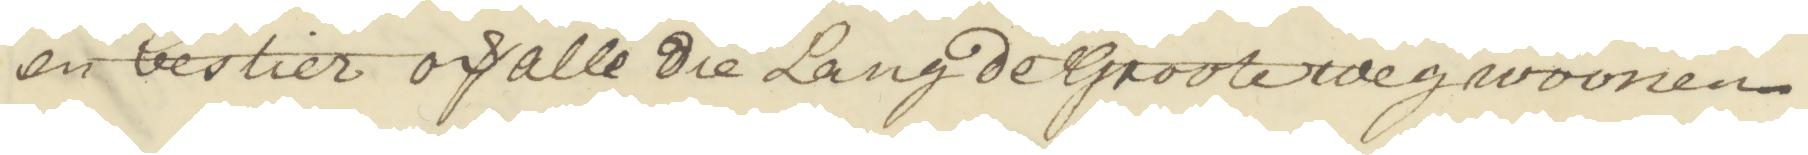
en bestier over alle die Lang de Groote weg woonen
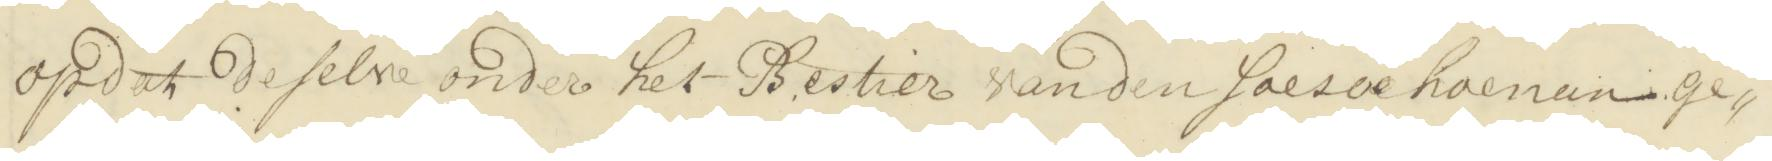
op dat deselve onder het Bestier van den soesoehoenan ge„
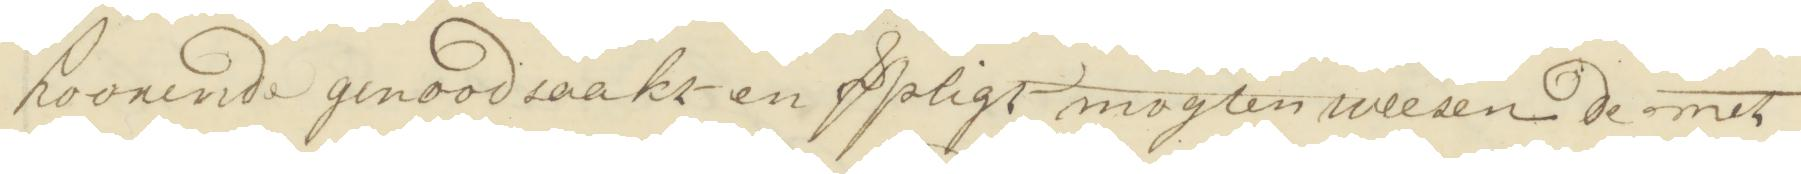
hoorende genoodsaakt en verpligt mogten weesen de met
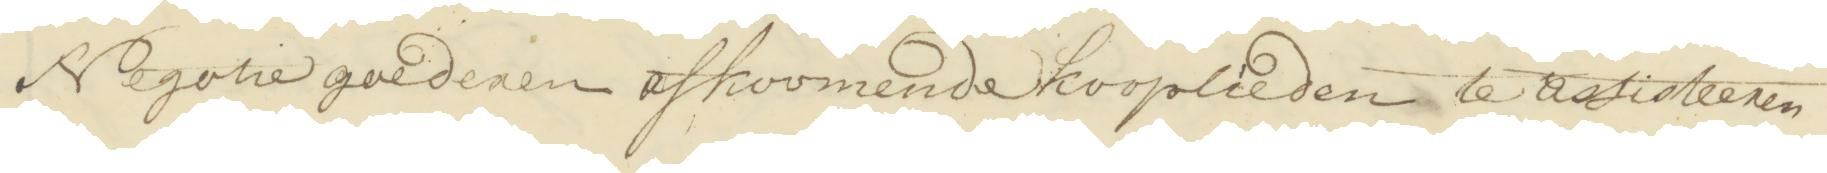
Negotie goederen afkoomende kooplieden te assisteeren
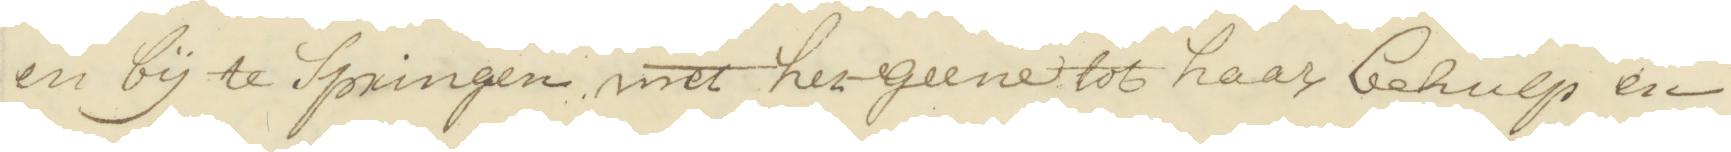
en bij te springen met het geene tot haar behulp en
